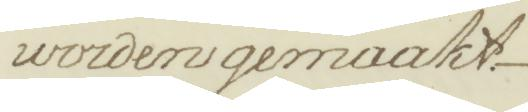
worden gemaakt—
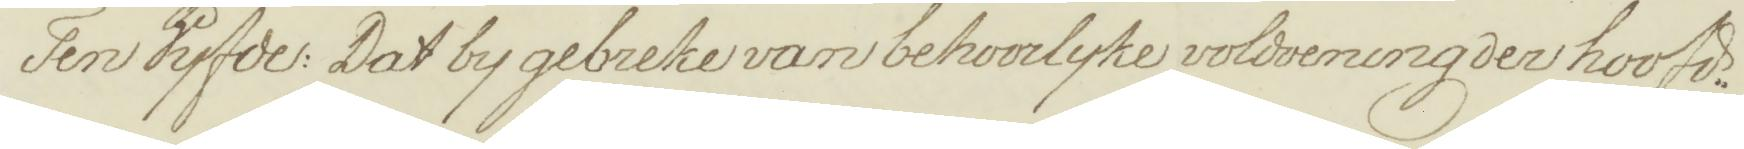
Ten Vyfde: Dat by gebreke van behoorlyke voldoening der hoofd„
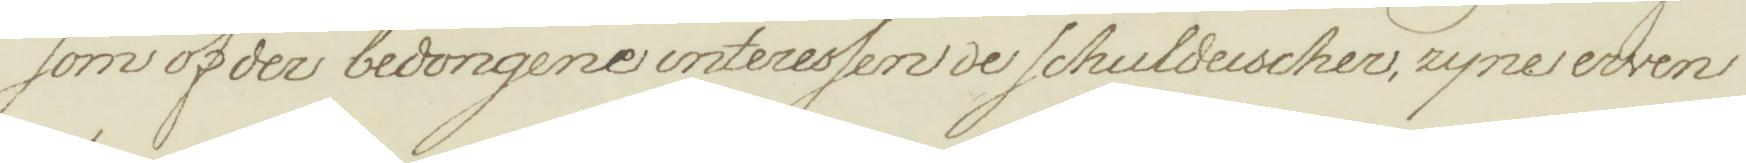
som of der bedongene interessen de Schuldeischer, zyne erven
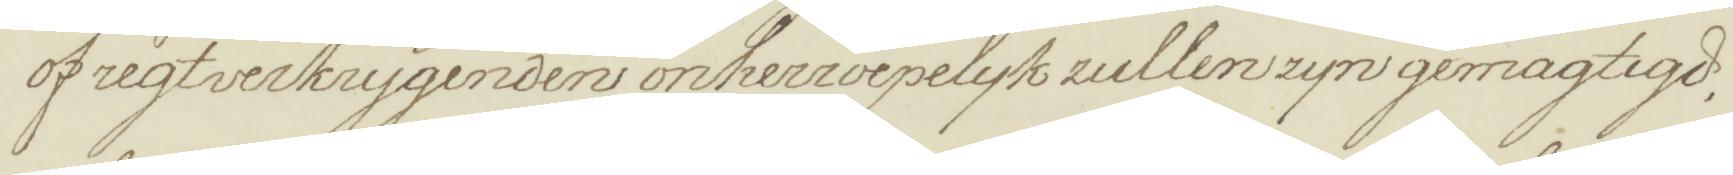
of regt verkrygenden onherroepelyk zullen zyn gemagtigd,
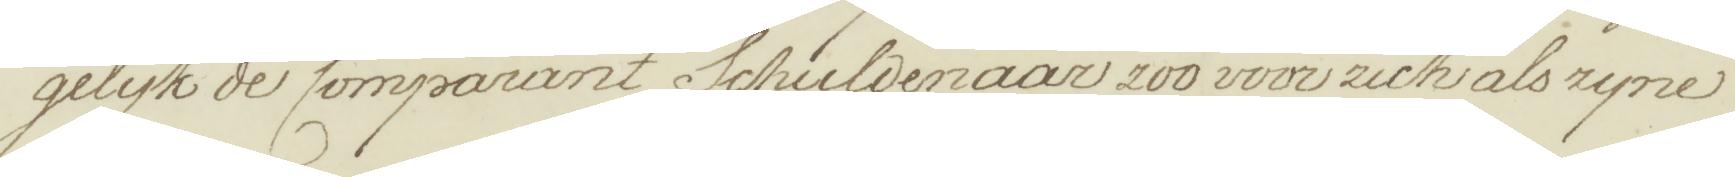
gelyk de Comparant schuldenaar zoo voor zich als zyne
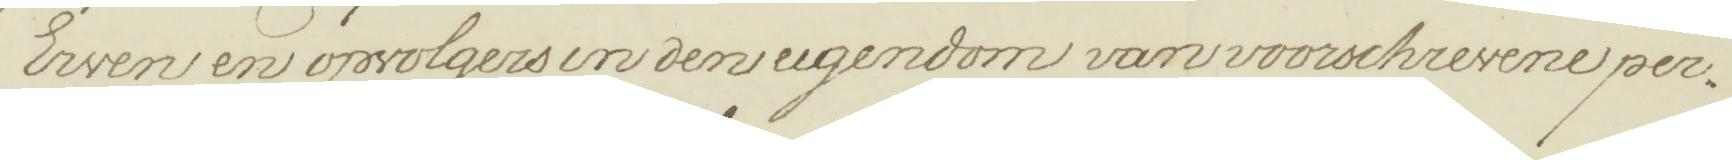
Erven en opvolgers in den eigendom van voorschrevene per„
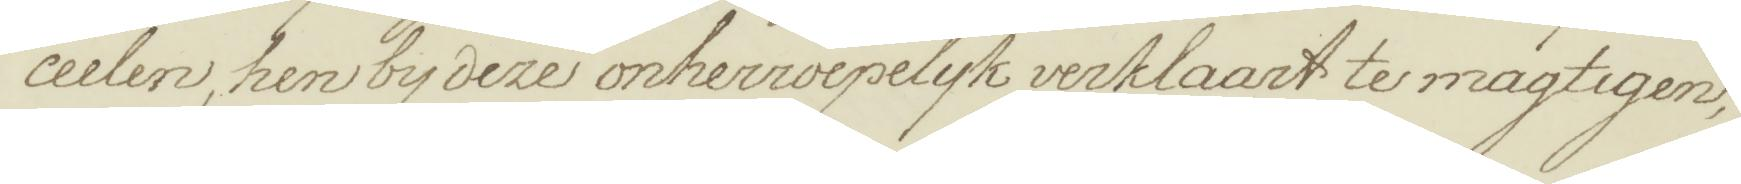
ceelen, hen by deze onherroepelyk verklaart te magtigen,
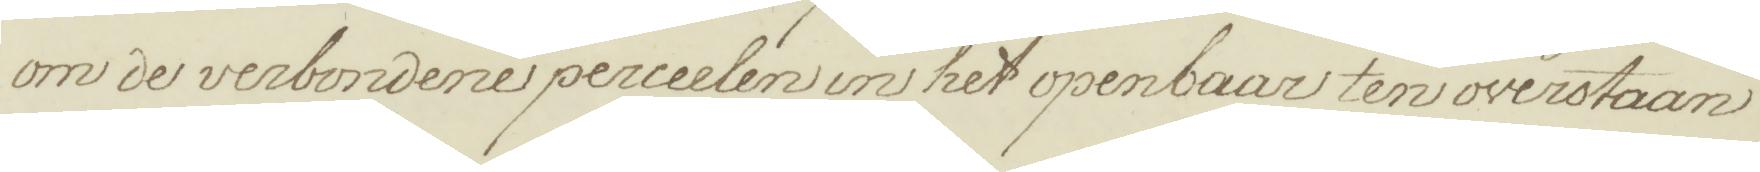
om de verbondene perceelen in het openbaar ten overstaan
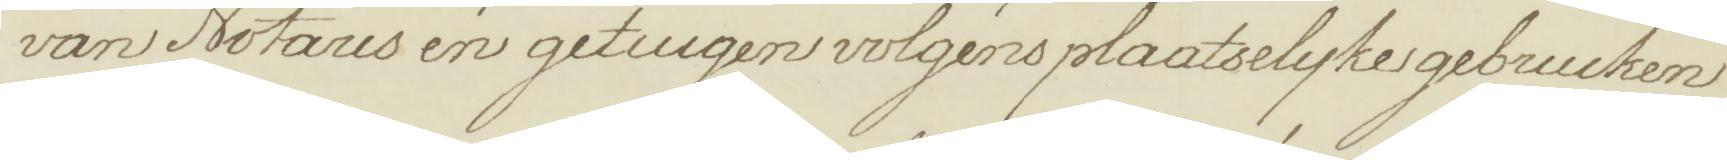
van Notaris en getuigen volgens plaatselyke gebruiken
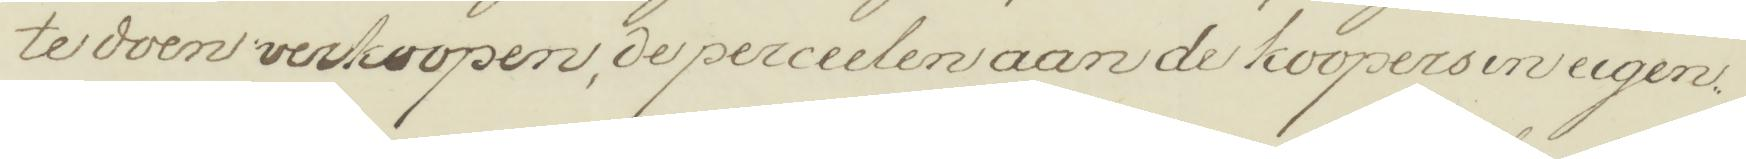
te doen verkoopen, de perceelen aan de koopers in eigen„
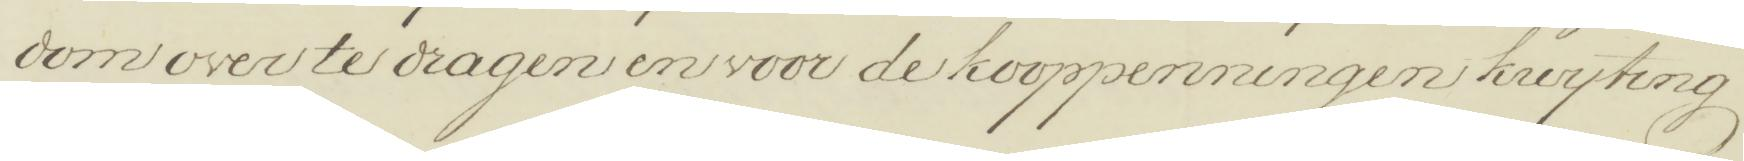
dom over te dragen en voor de kooppenningen kwijting
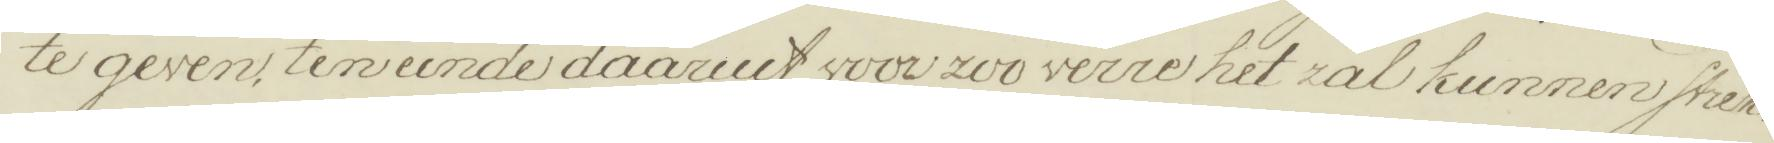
te geven, ten einde daaruit voor zoo verre het zal kunnen Strek
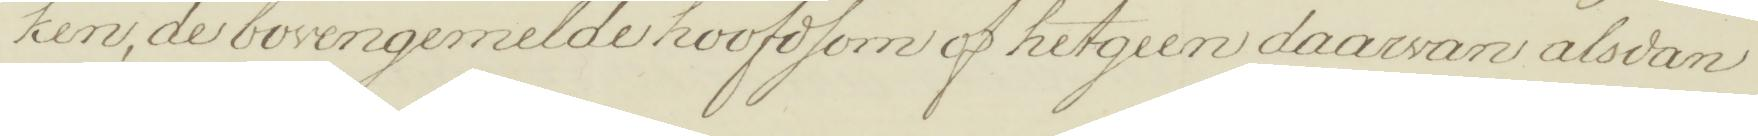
ken, de bovengemelde hoofdsom of hetgeen daarvan als dan
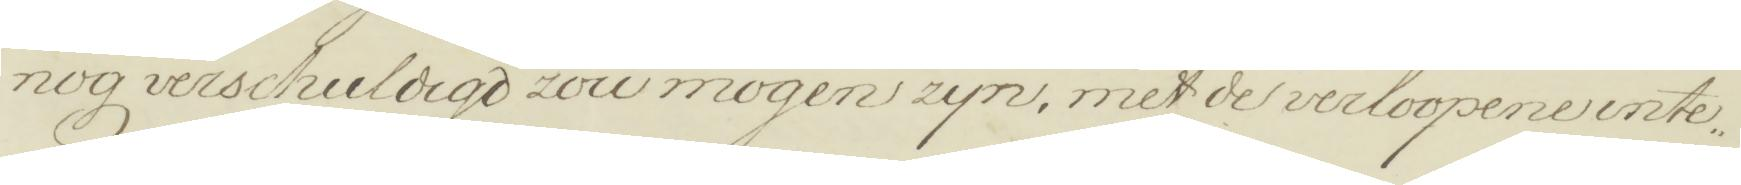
nog verschuldigd zou mogen zyn, met de verloopene inte„
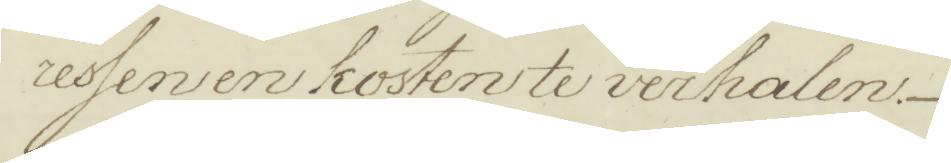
ressen en kosten te verhalen.—
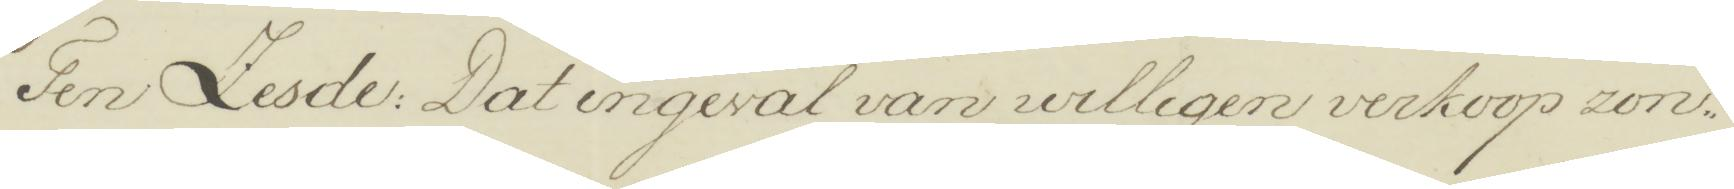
Ten Zesde: Dat ingeval van willigen verkoop zon„
